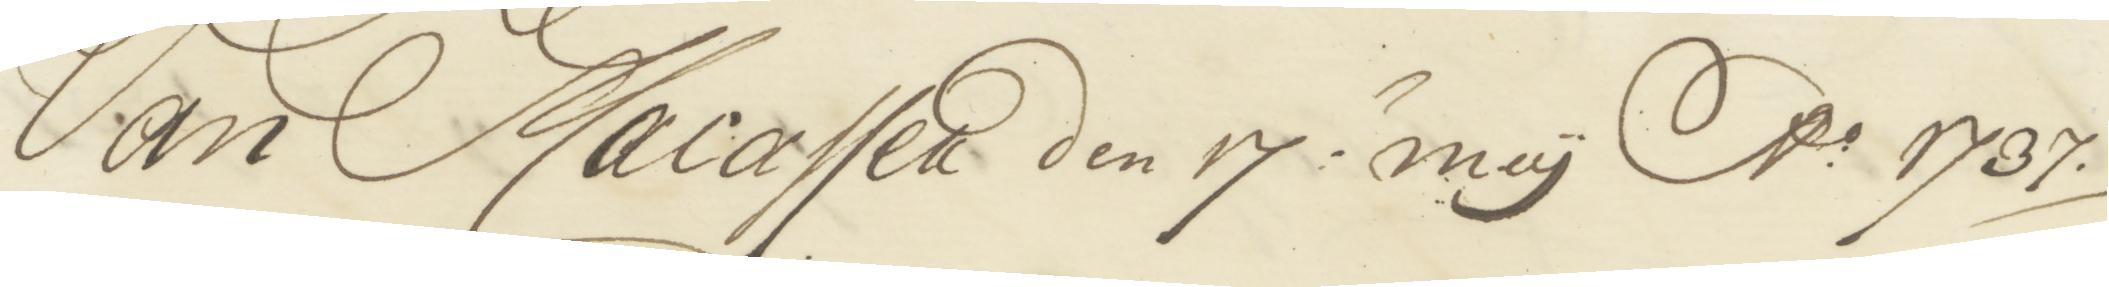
Van Macasser den 17:' meij A:o 1737.
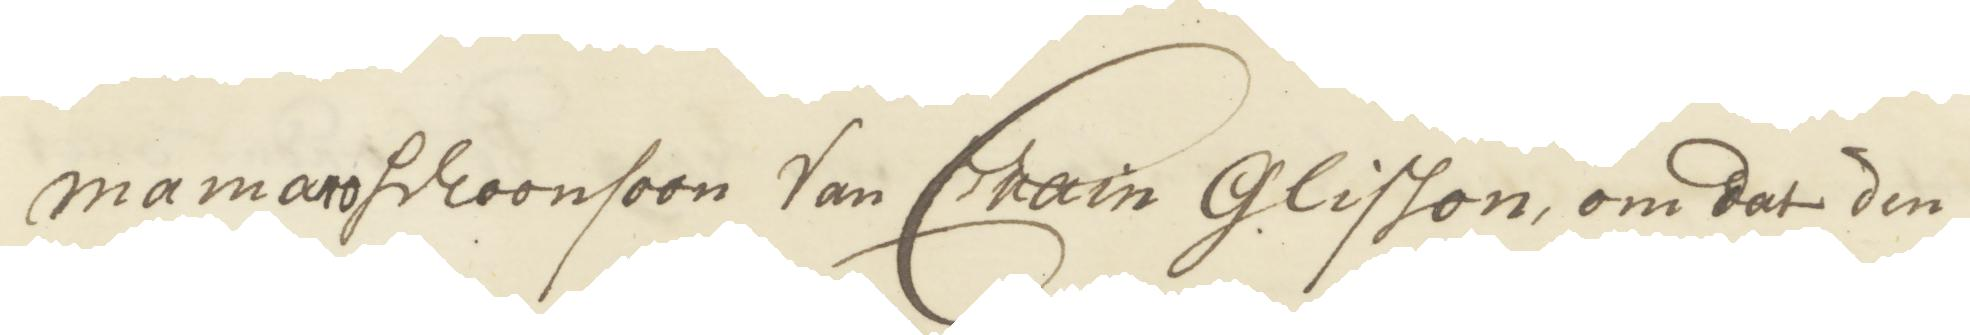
mamaro schoonsoon van Crain Glisson, om dat den
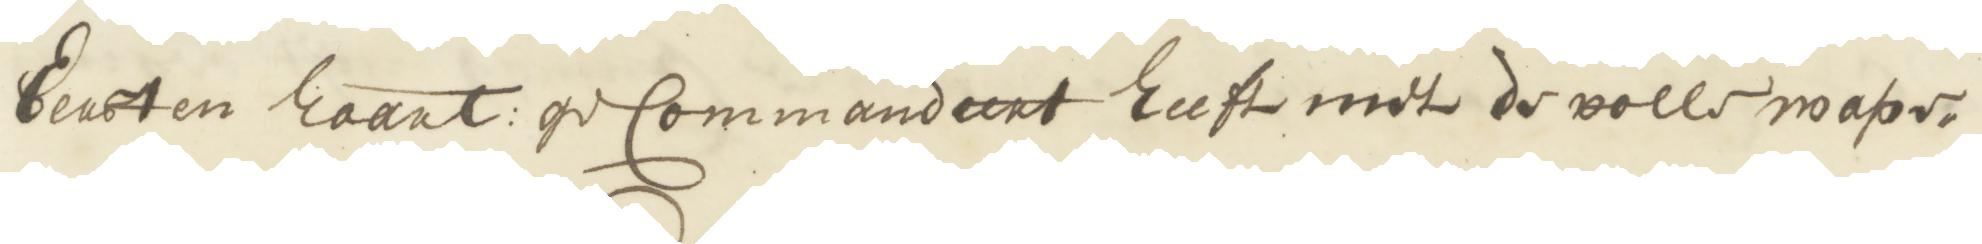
Eersten haart: gecommandeert heeft met de volle wape„
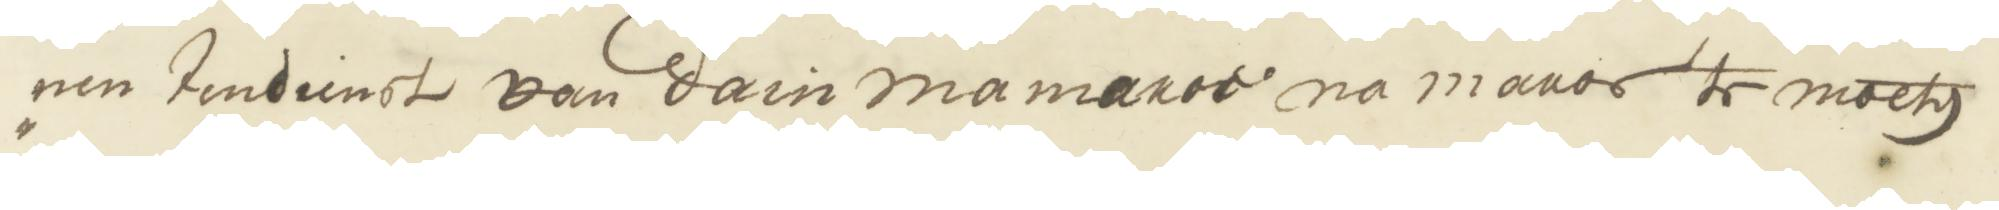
„nen tendienst van dain mamaroe na maros te moeten
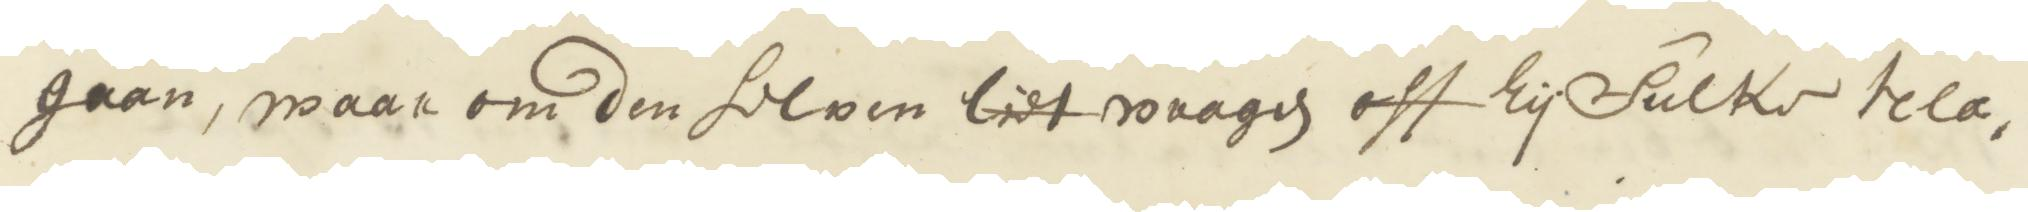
gaan, waar om den selven liet vragen off hij sulke kla„
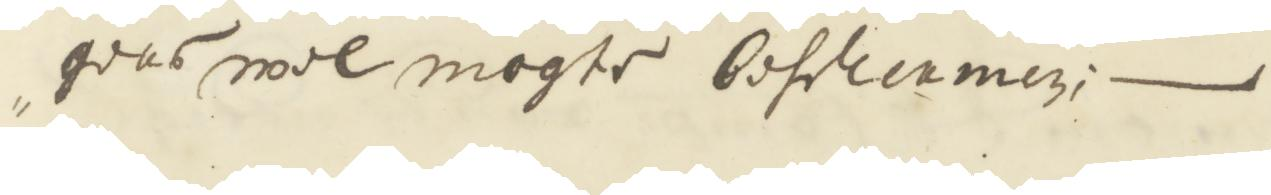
„gers wel mogte beschermen; —
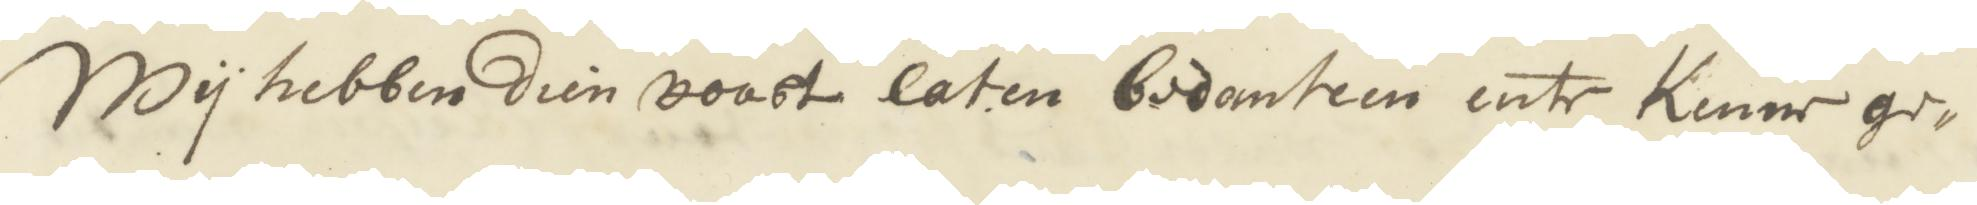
Wij hebben dien vorst laten bedanken ente kenne ge„
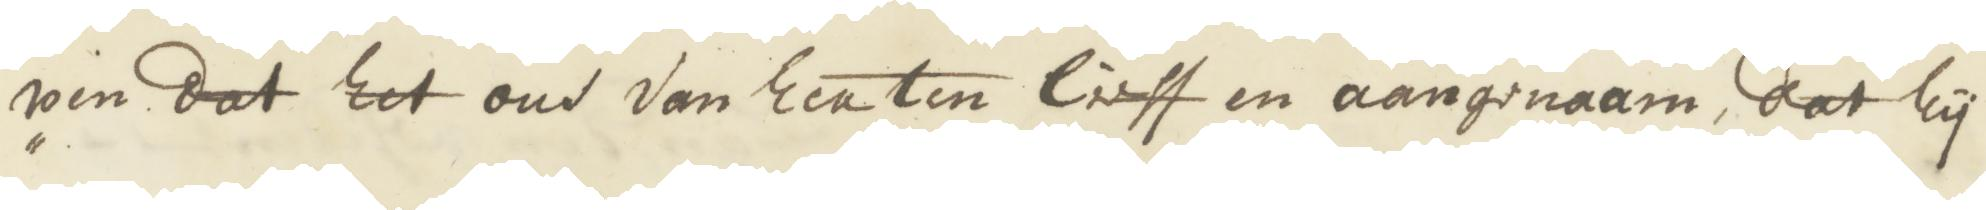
„ven dat het ons van herten lieff en aangenaam, dat hij
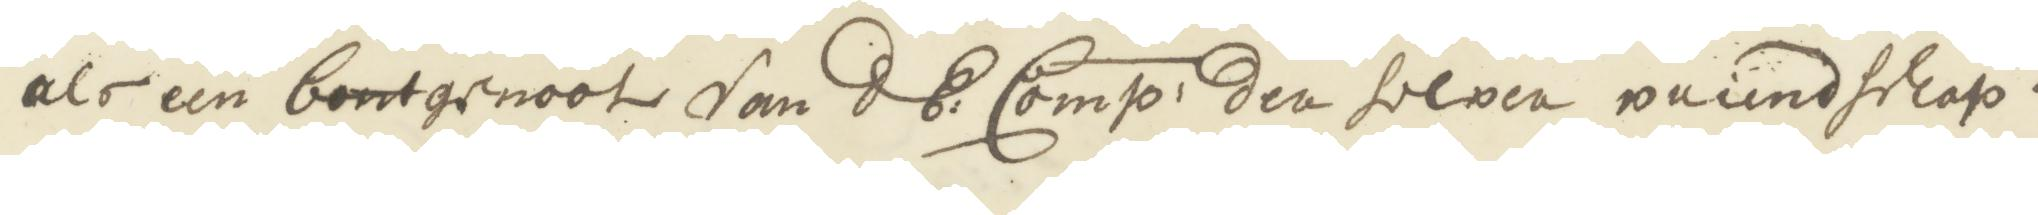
als een bontgenoot van d E: Comp: der selver vrundschap
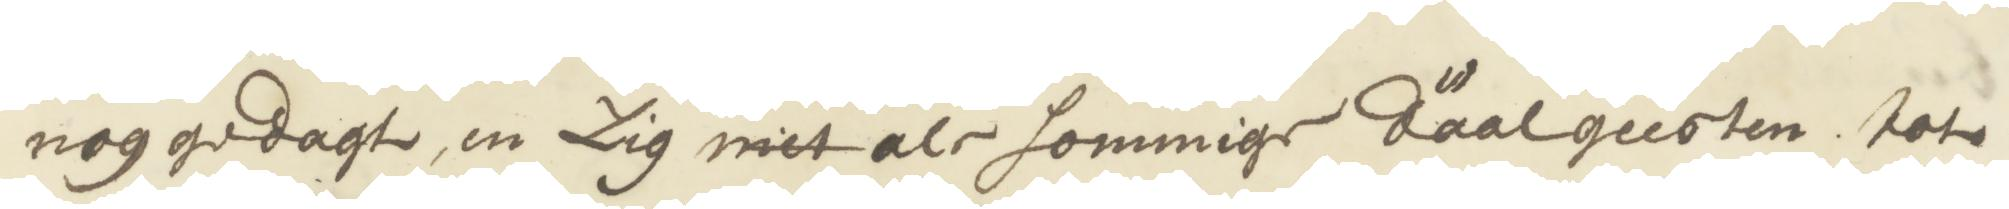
nog gedagt, en zig niet als sommigs dwaalgeesten tot
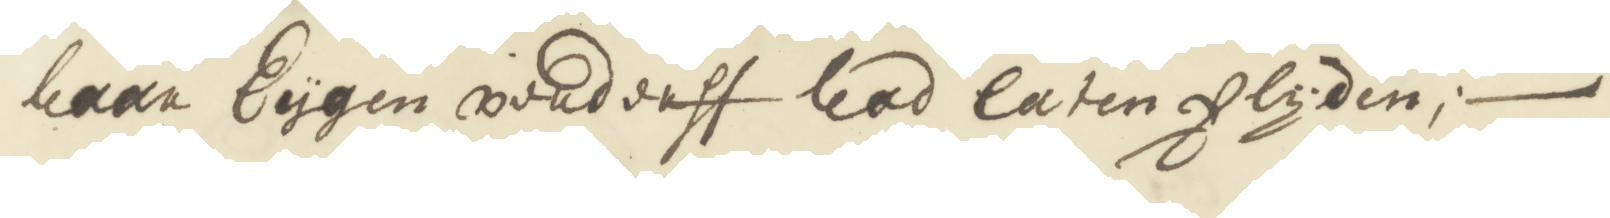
haar Eijgen verderff had laten verlijden; —
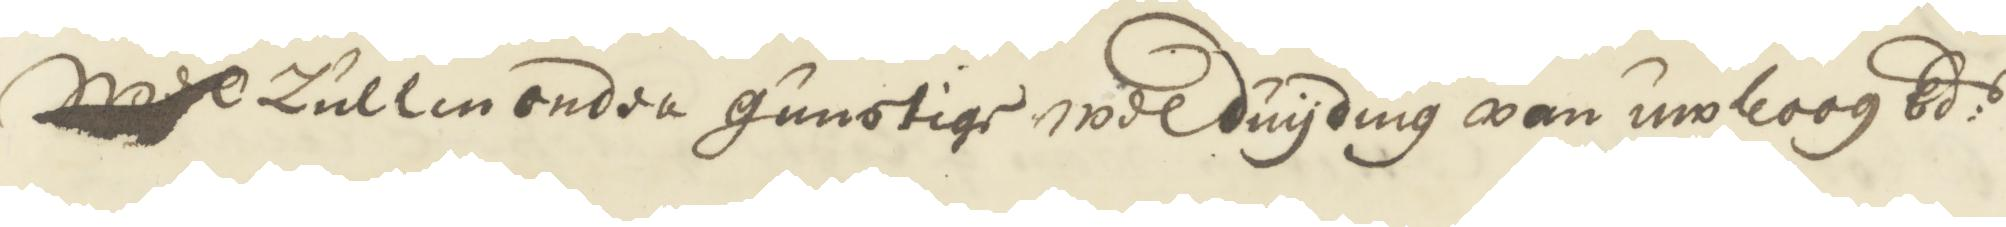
Wel zullen onder gunstige welduijding van uw hoog Ed:s
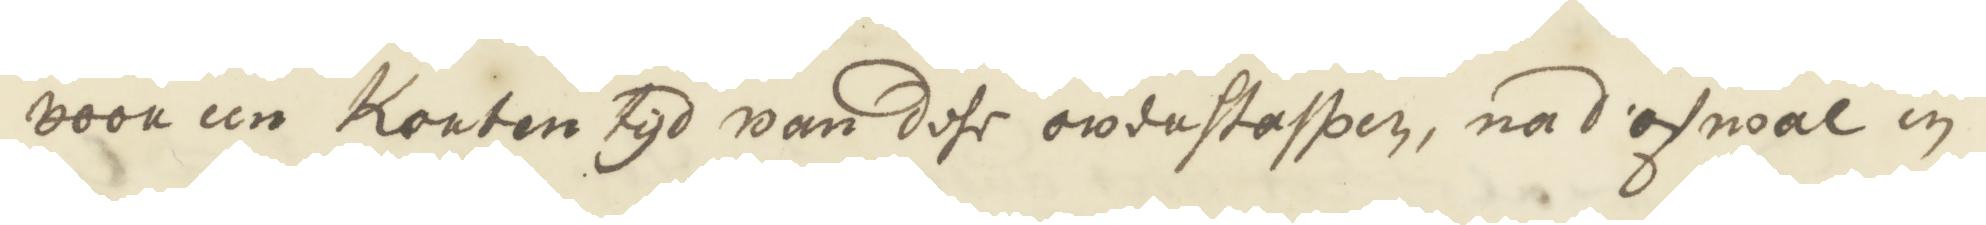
voor een korten tijd van dese overstappen, na d’overwal en
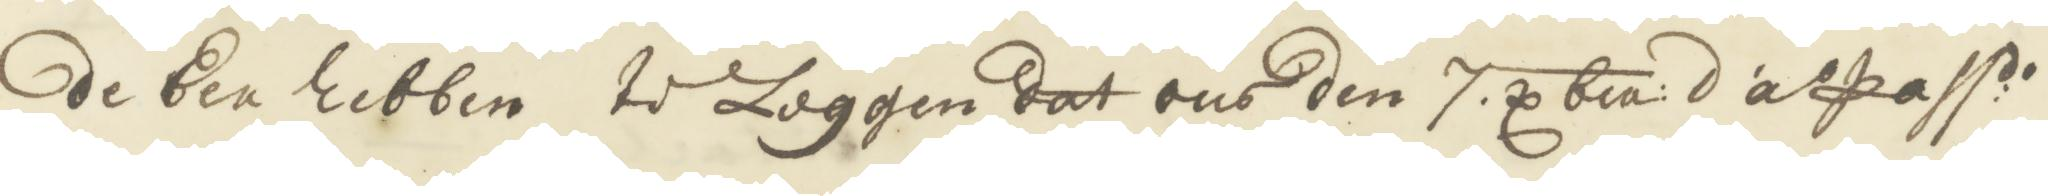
de Eer hebben te zeggen dat ons den 7. xber: d’ ao pass:to
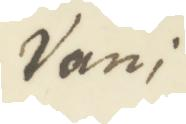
van;
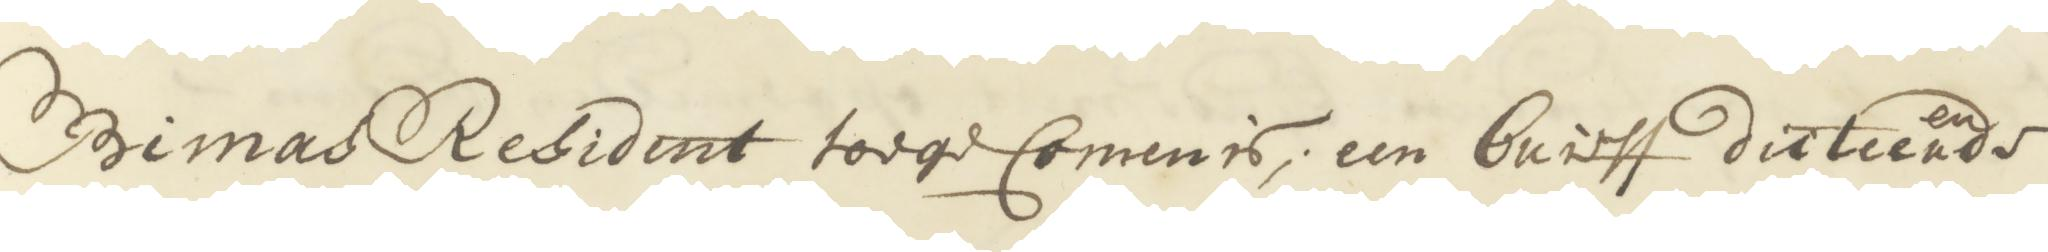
Bimas Resident toegecomen is; een brieff dicteerende
